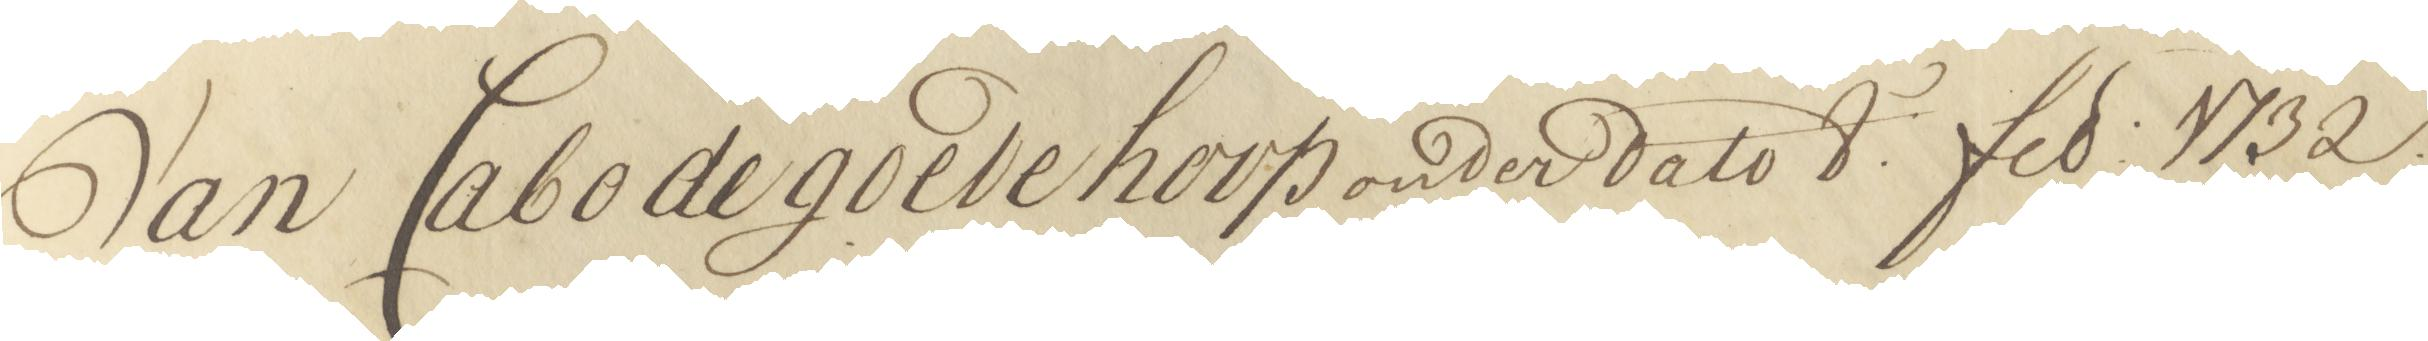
Van Cabo de goede hoop onder dato 8:' feb: 1732
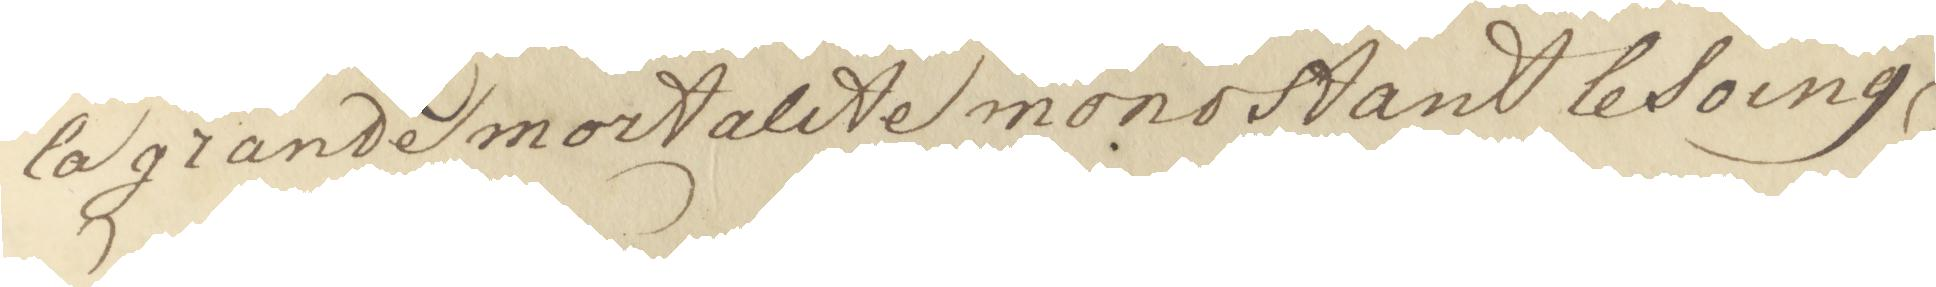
la grande mortalite monostant lesoing
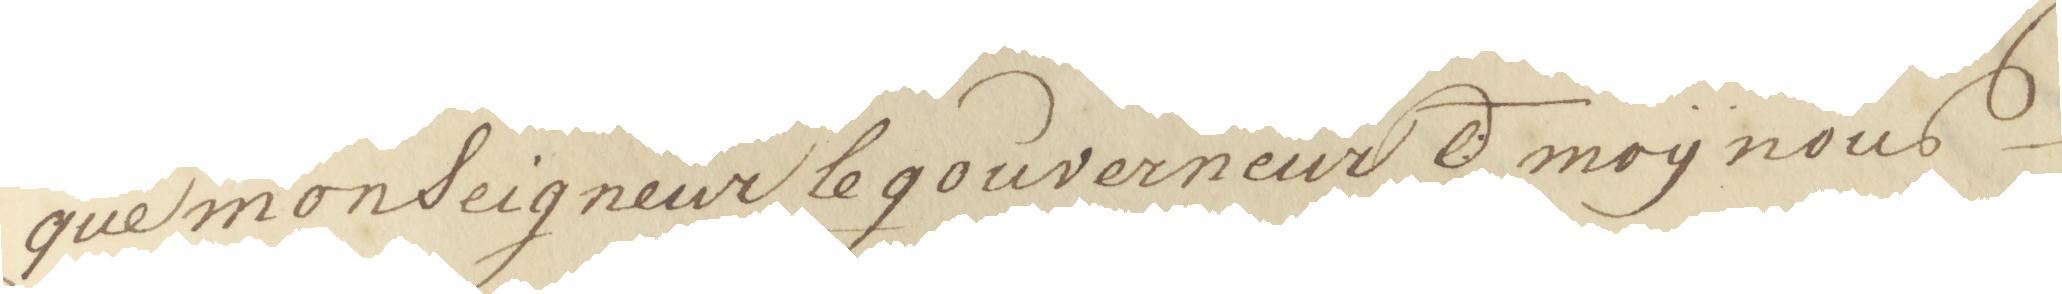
que monseigneur le gouverneur l: moij nous
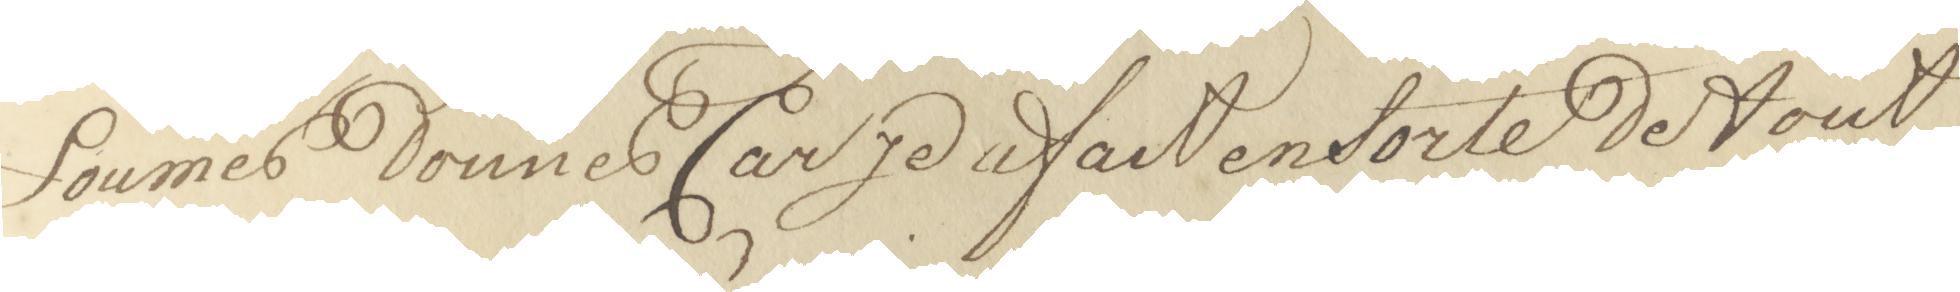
soumes donnes Car je afait en sorte de tout
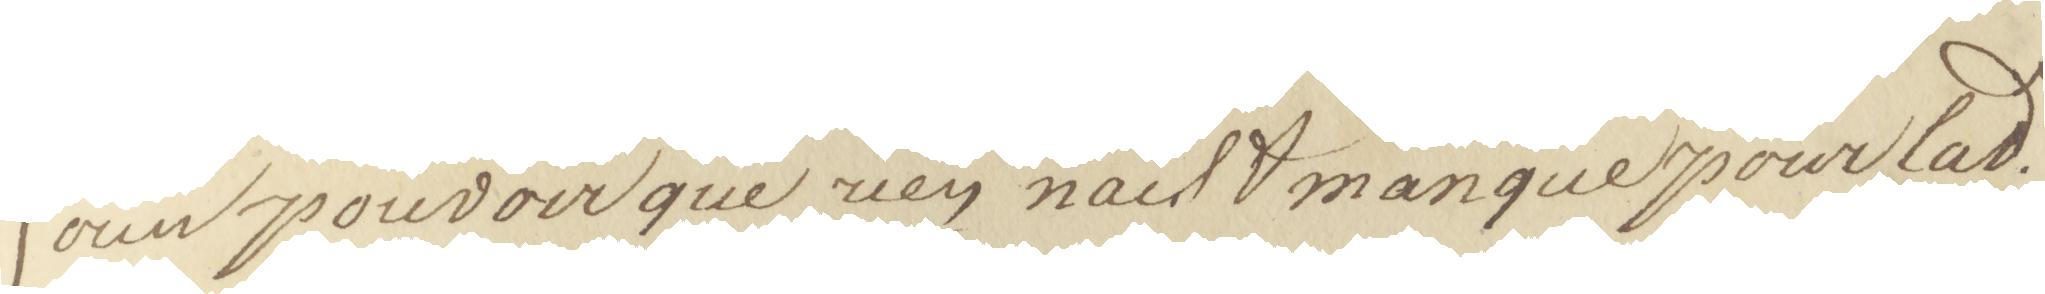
soun pouvoir que rien naist manque pour lad.r
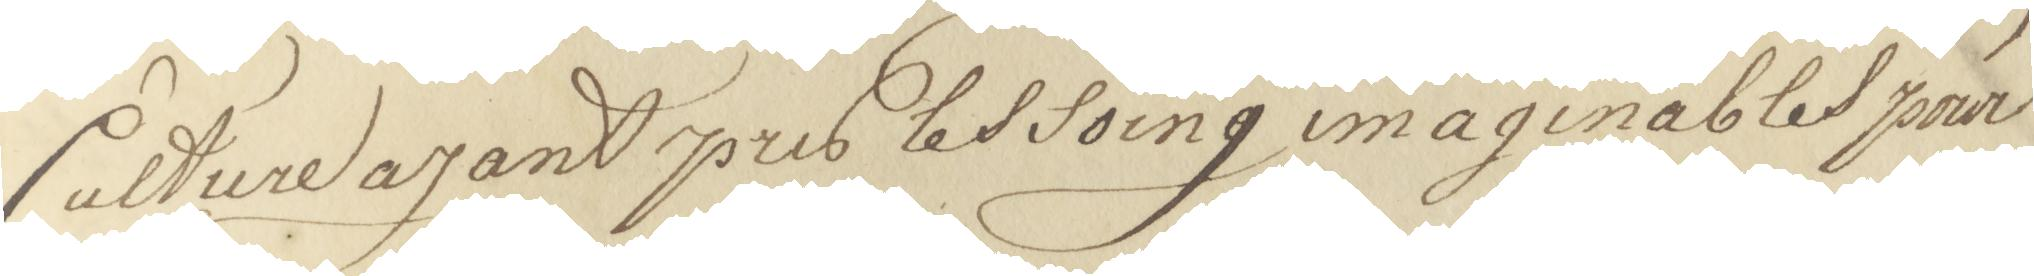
Culture ajant pris les soing imaginables pour
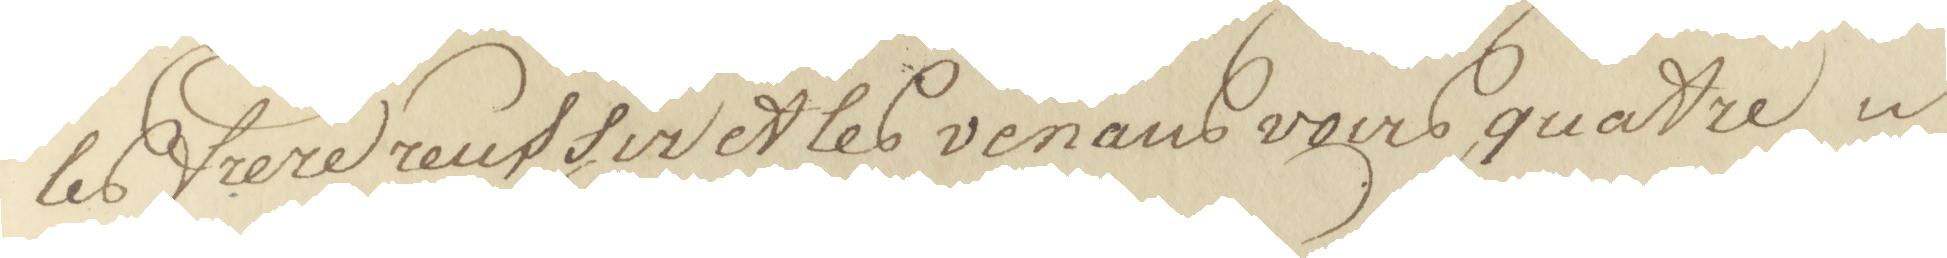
les frere reussir et les venans voirs quatre n
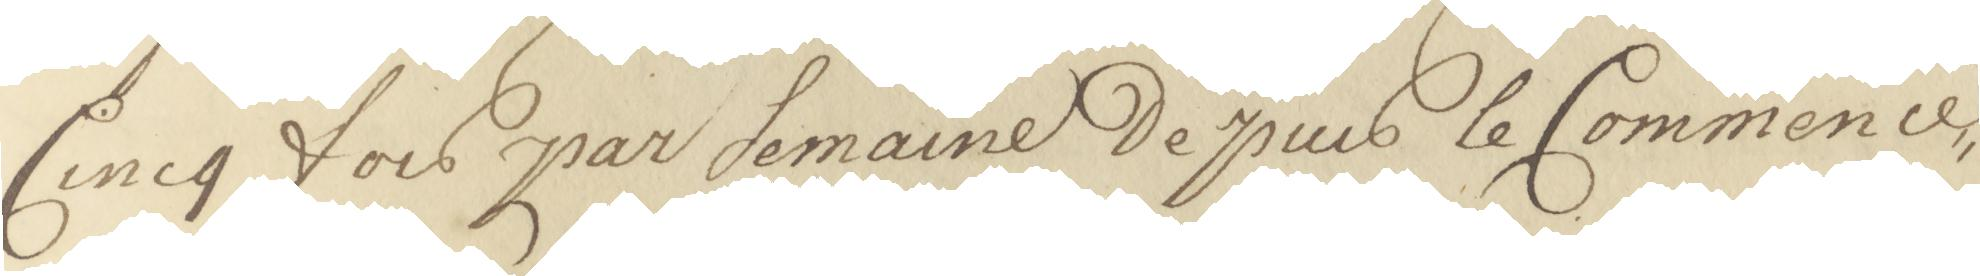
Cincq fois par semaine de puis le Commence„,
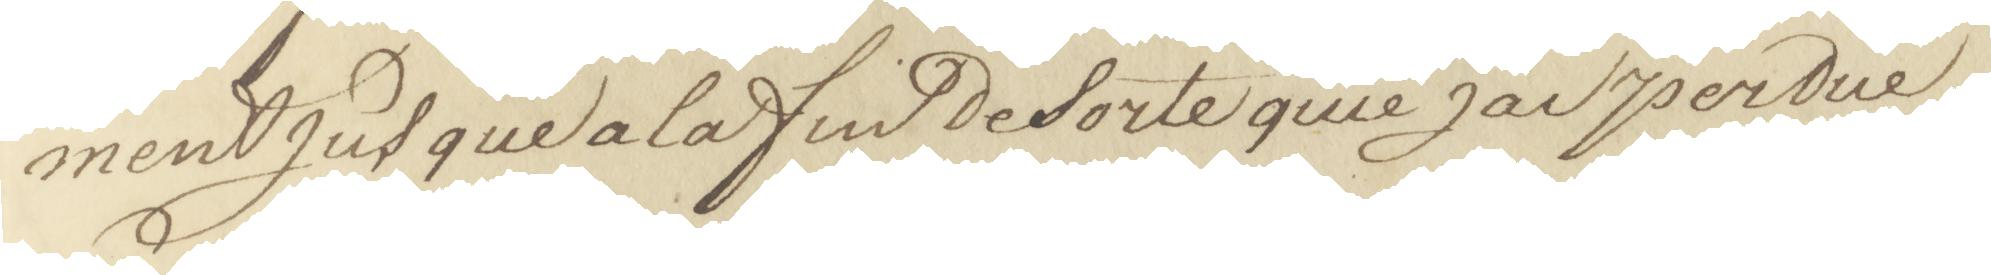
ment jusque a la fin desorte quie jai perdue
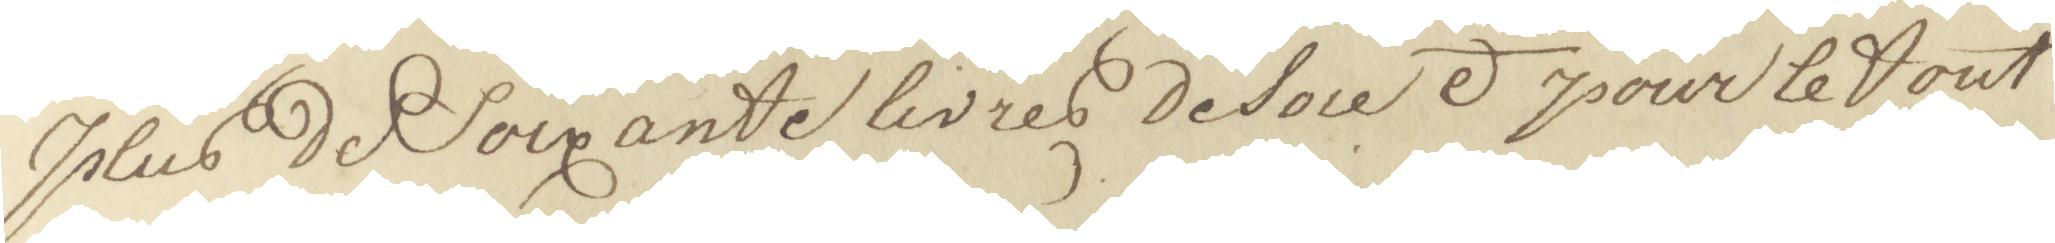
plus de soixante livres desoie l pour le tout
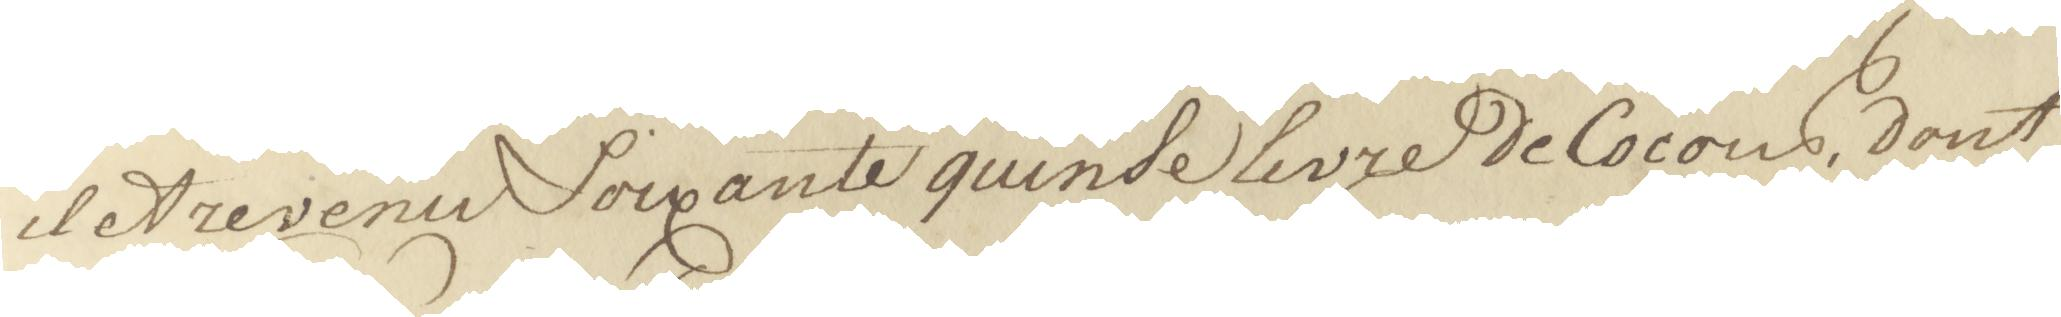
il et revenu soixante quinse livre de cocons, dont
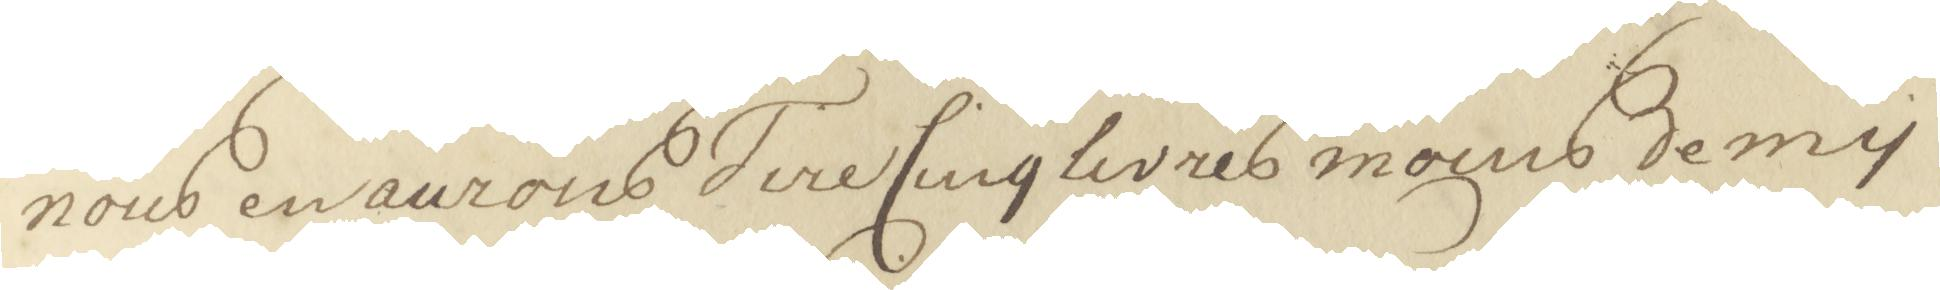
nous en aurons Tire cinq livres moins de mij
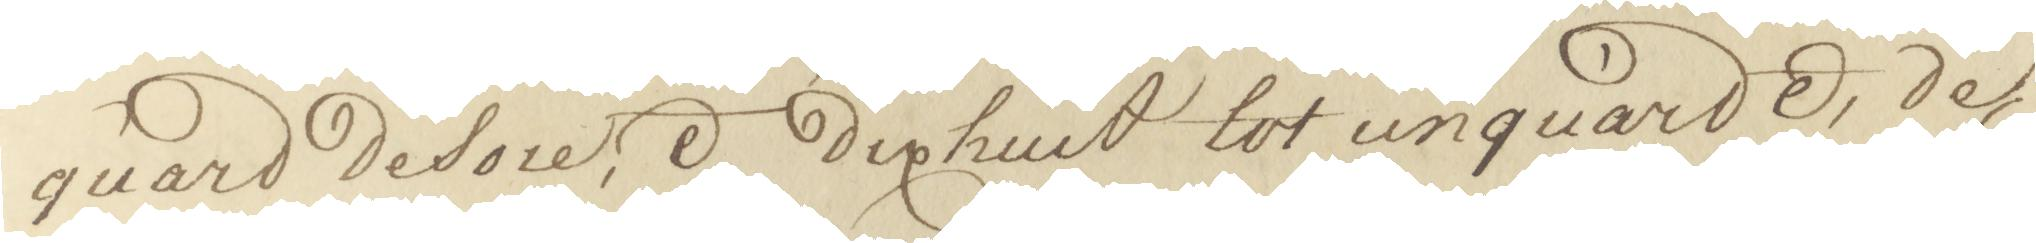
quard desoie, l dixhuit lot un quard l, de
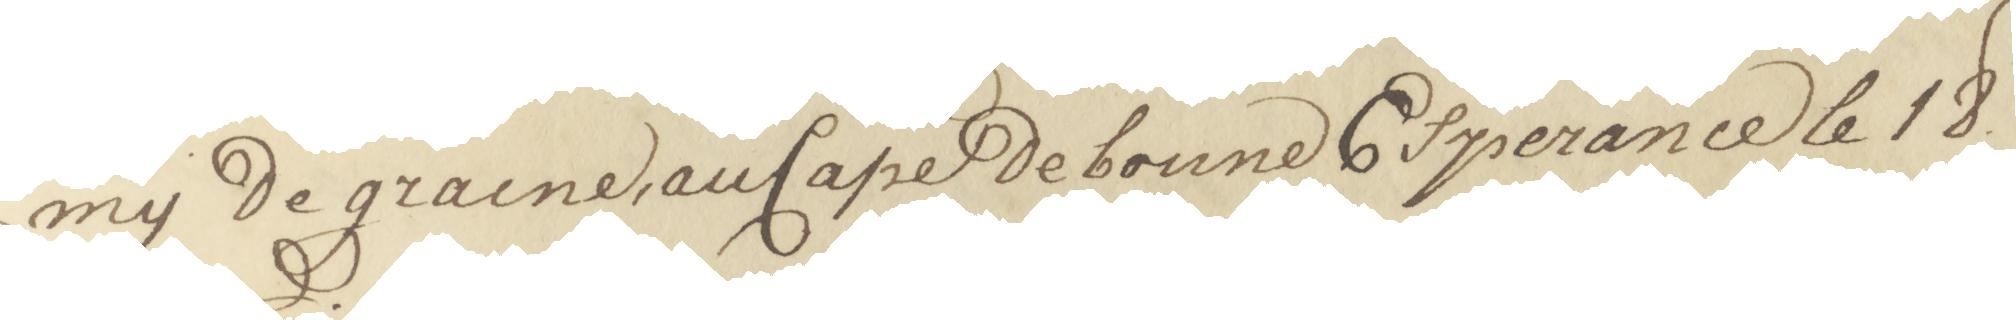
mij de graine, au Cape de bonne Esperance le 18
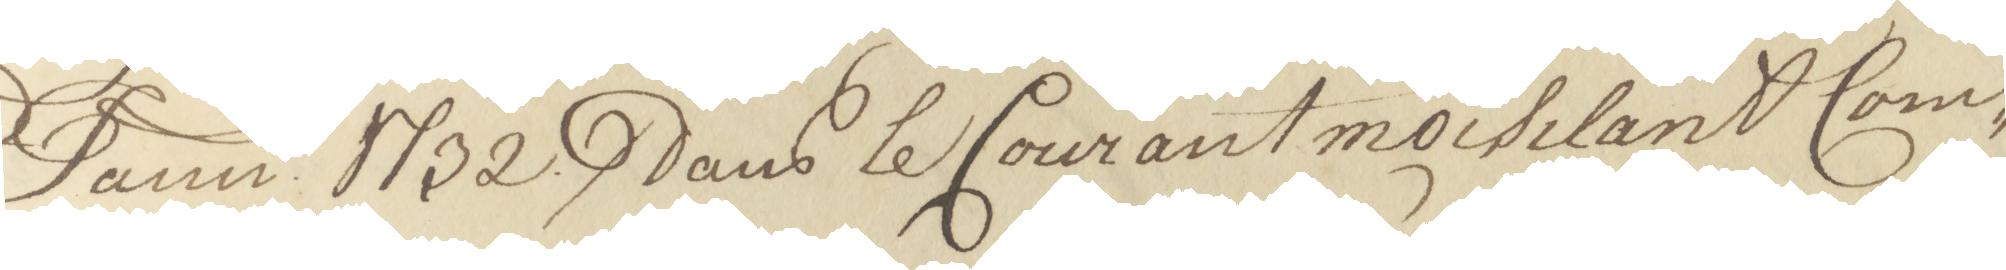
Ianu: 1732. / dans le Courant moisilant Com
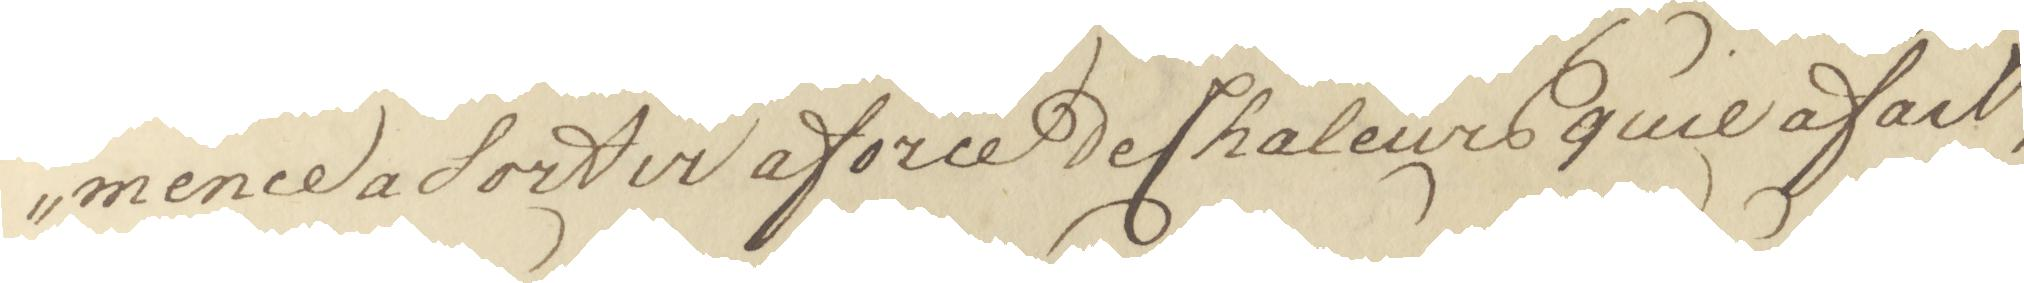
„mence a sortir aforce de Chaleurs quie afait
